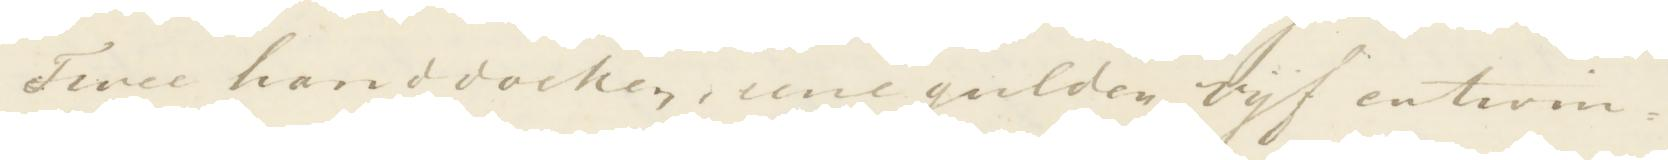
Twee handdoeken, eene gulden vijf entwin„
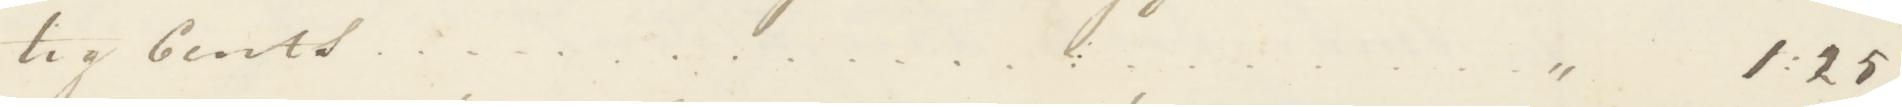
tig Cents . . . . . . . . . . . . . . . . . . . . . . . . . . . . . . . . . . .„ 1:25
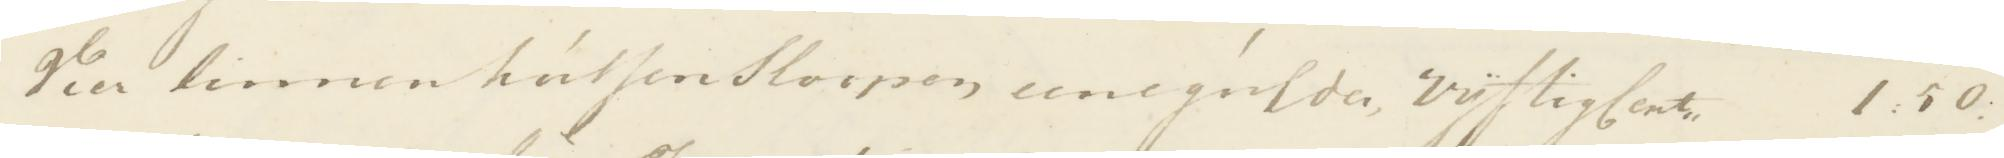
Vier linnen kussensloopen eene gulden vijftig Cent „ 1:50.
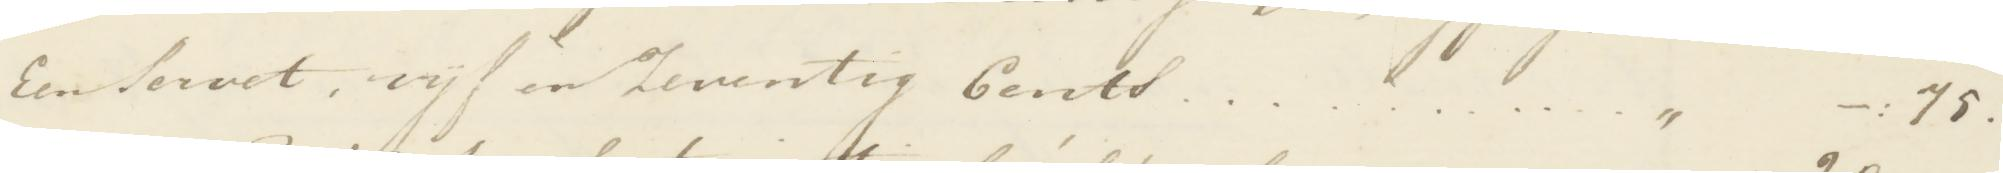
Een servet, vijf en zeventig Cents . . . . . . . . . . . . . . . .„ —:75.
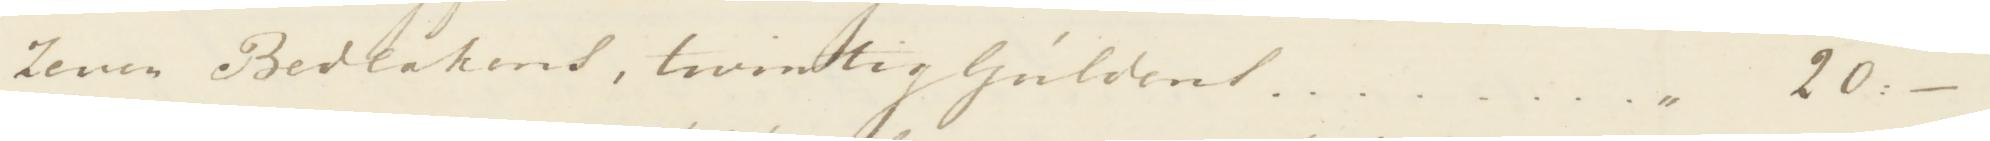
Zeven Bedlakens, twintig guldens . . . . . . . . . . . . „ 20:—
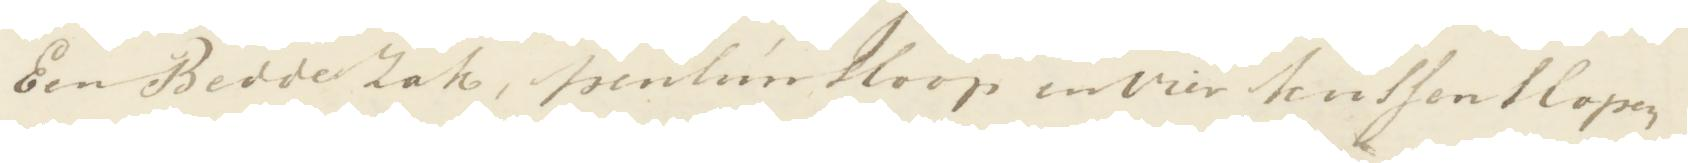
Een Beddezak, peuluwsloop en vier kussen slopen
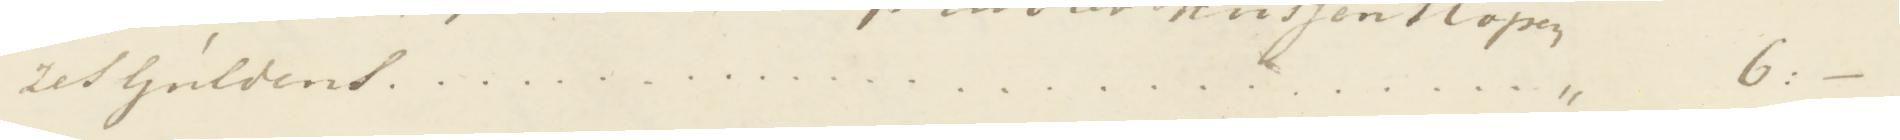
zes guldens . . . . . . . . . . . . . . . . . . . . . . . . . . . . . . . .„ 6:—
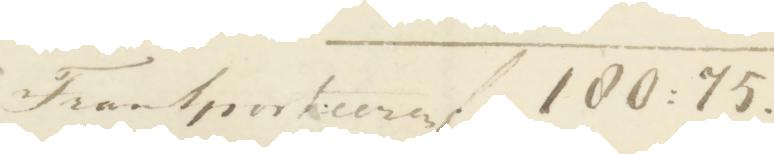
Transporteeren ƒ180:75.
